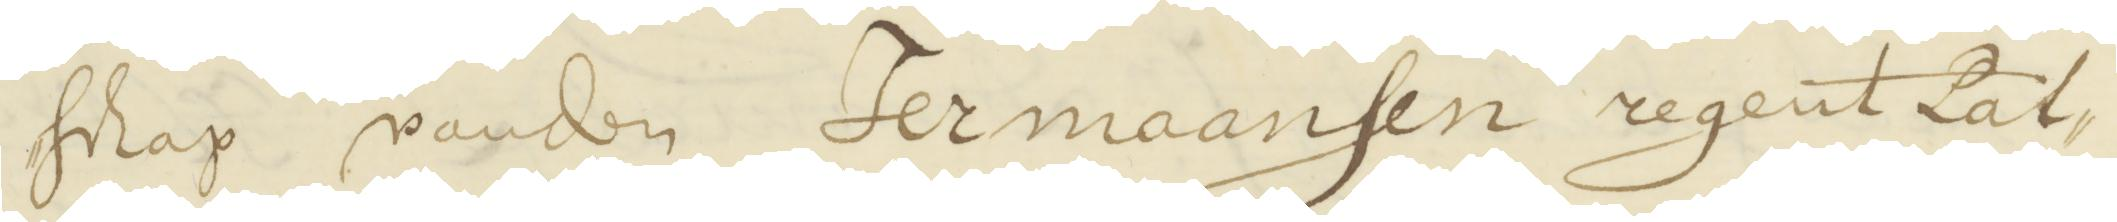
„schap vanden Termaansen regent Pal„
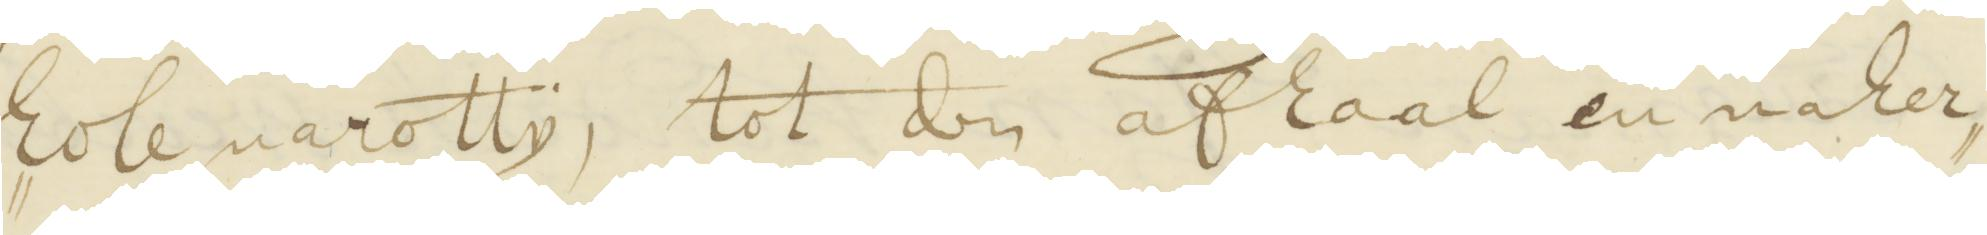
„hole narottij, tot den afhaal en naher„
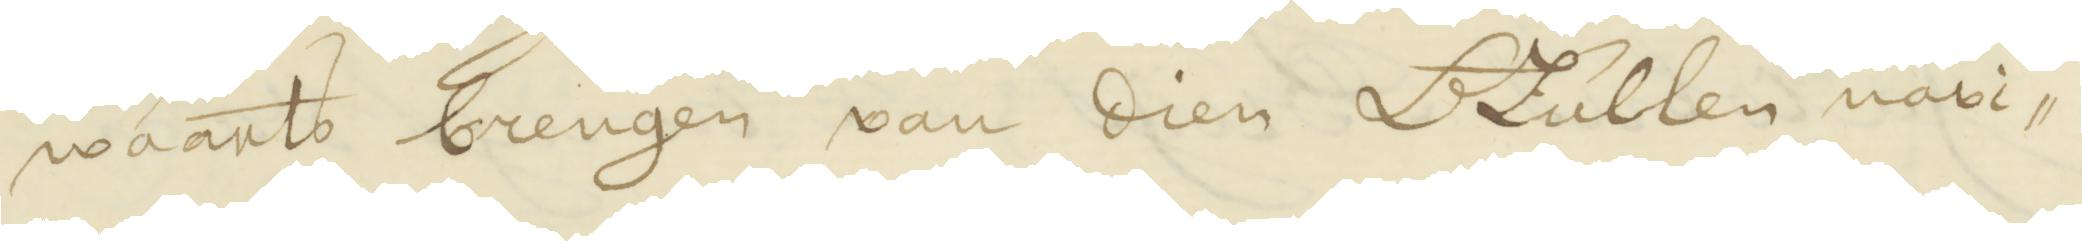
waarts brengen van dien te zullen navi„
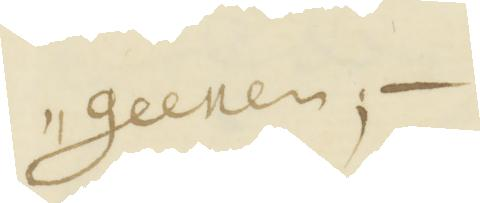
„geeren; —
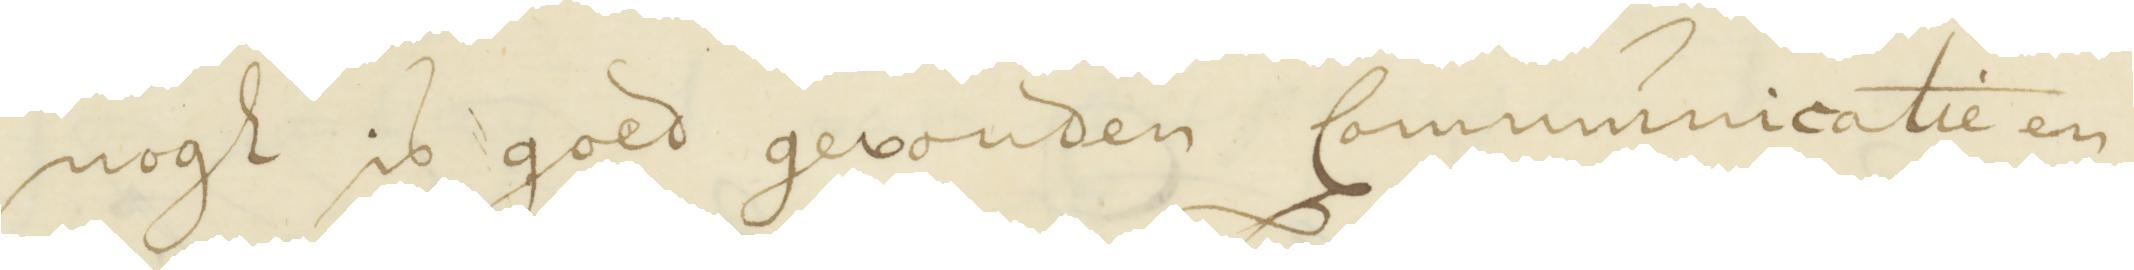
nogh is goed gevonden Communicatie en
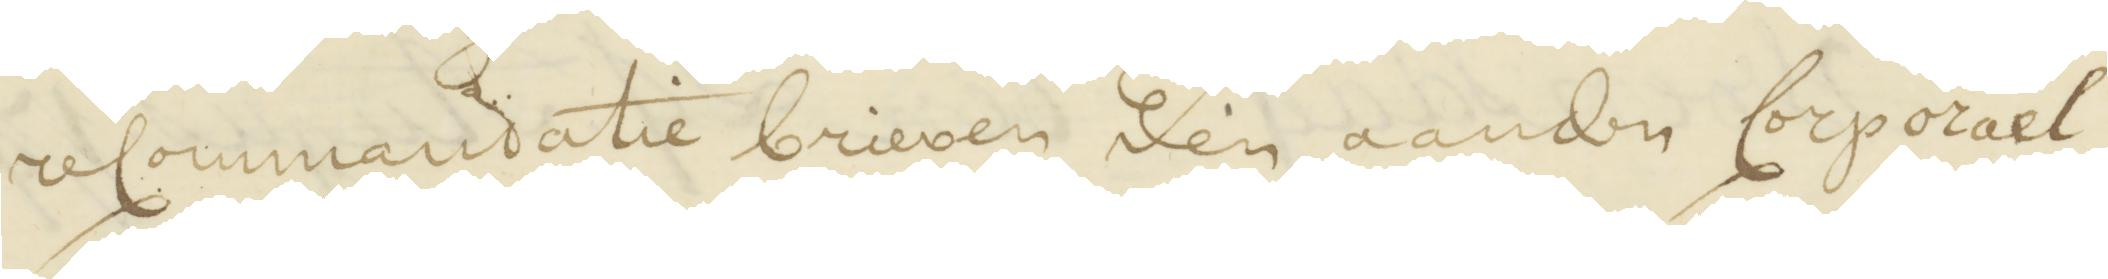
recommandatie brieven Een aanden Corporael
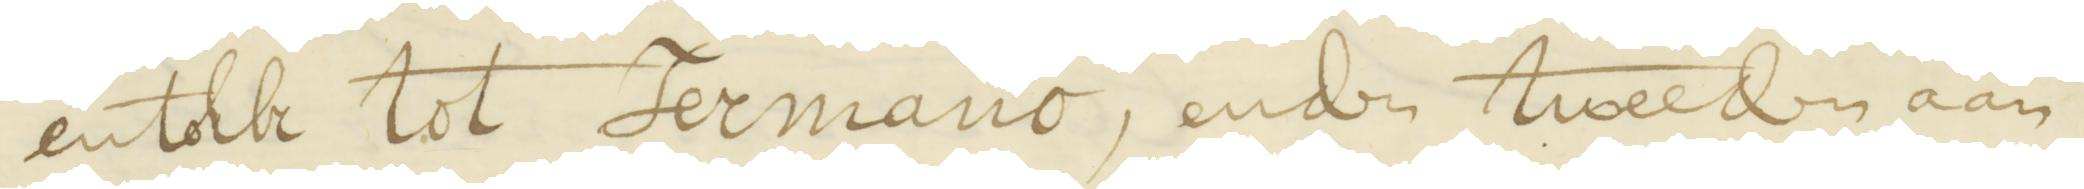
en tolk tot Termano, enden tweeden aan
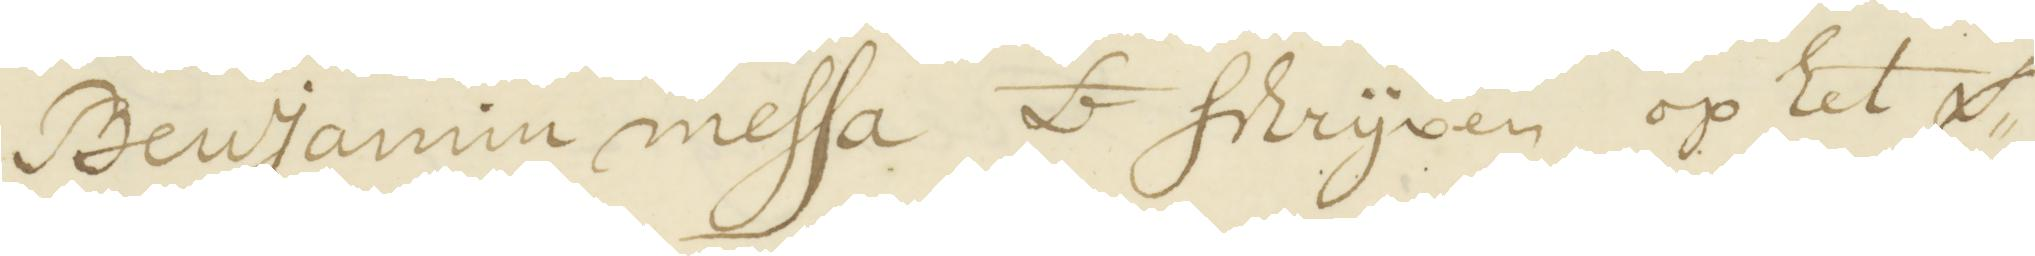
Benjamin messa te schrijven op het ver„
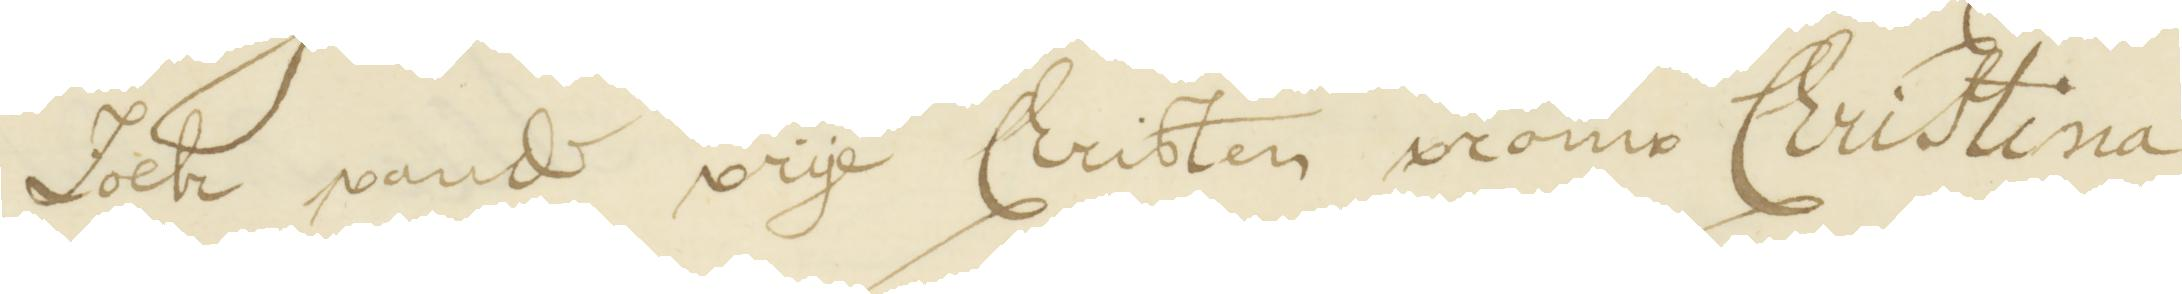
zoek vande vrije Christen vrouw Christina
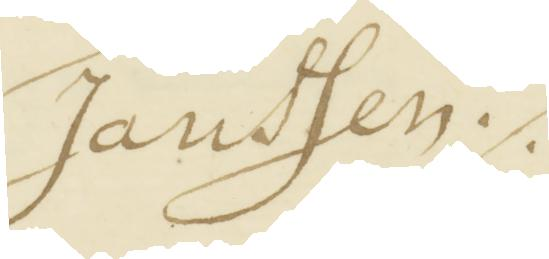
Janssen./.
